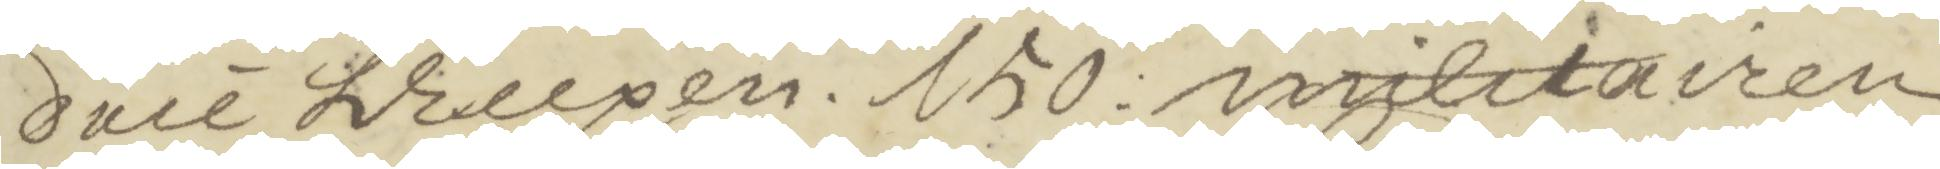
drie scheepen. 150: militairen
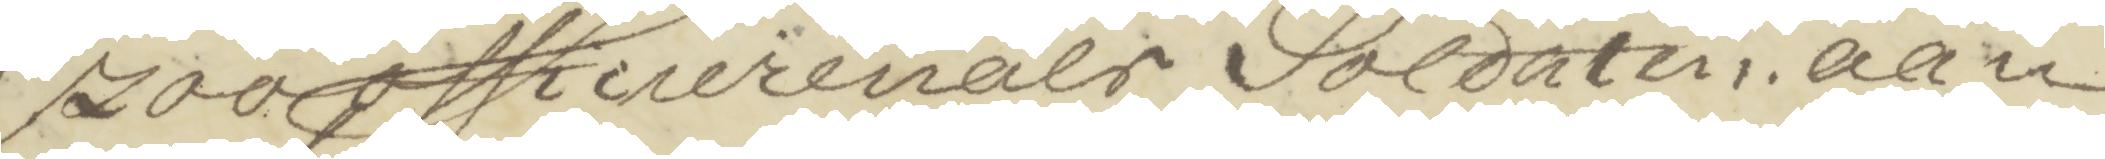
zoo officieren als soldaten aan
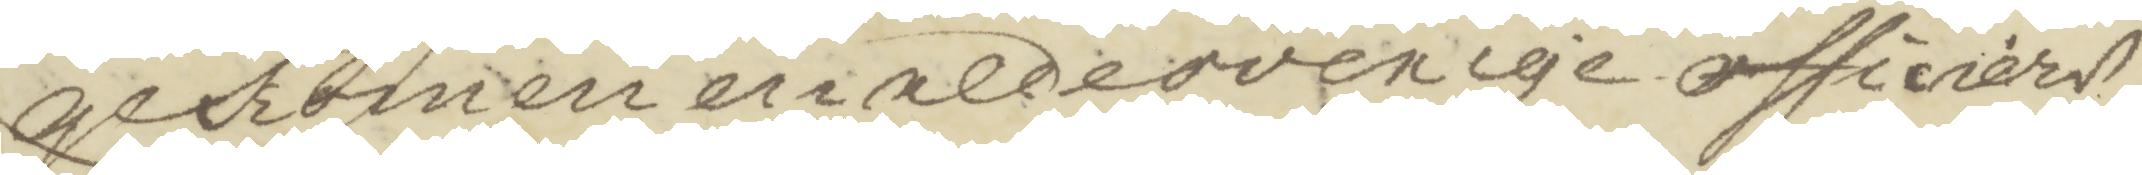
gekomen en alde overige officiers
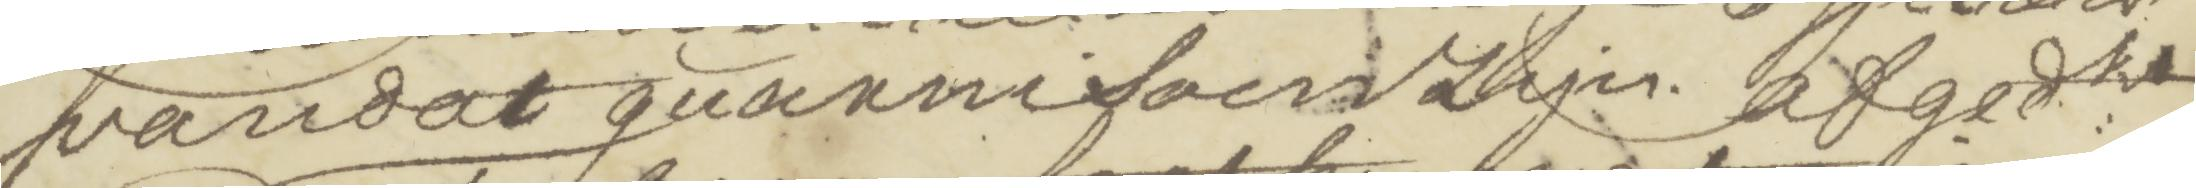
van dat guarnisoen zijn. afged:kt
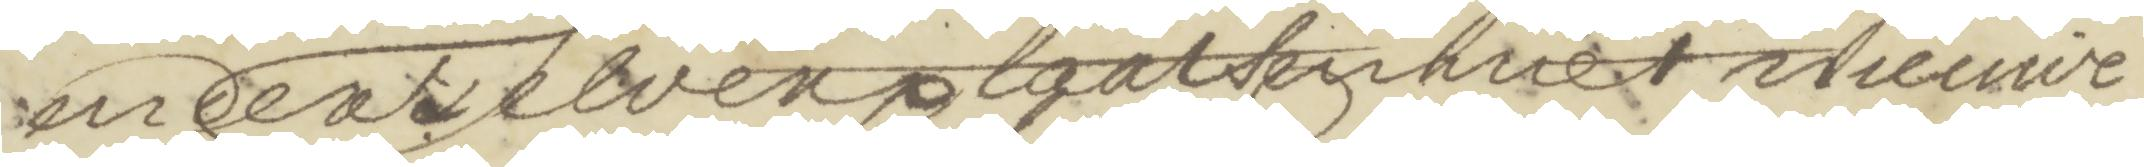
en derzelver plaatsen met nieuwe
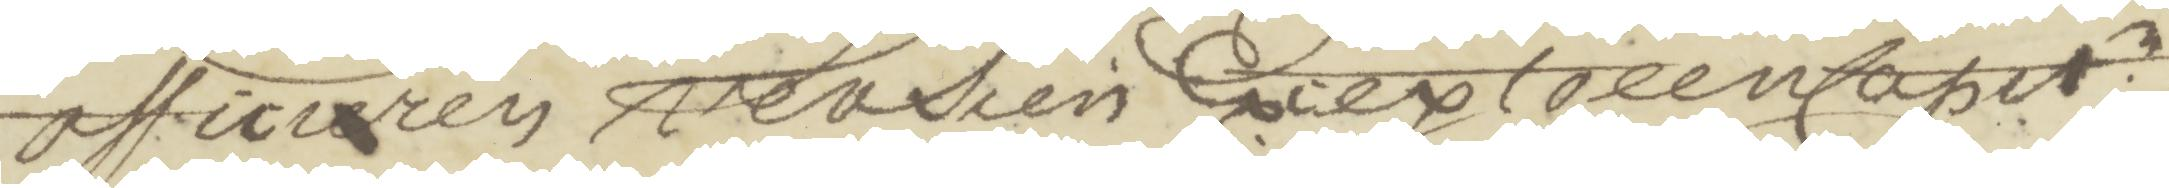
officieren versien Excepto een Capit:n
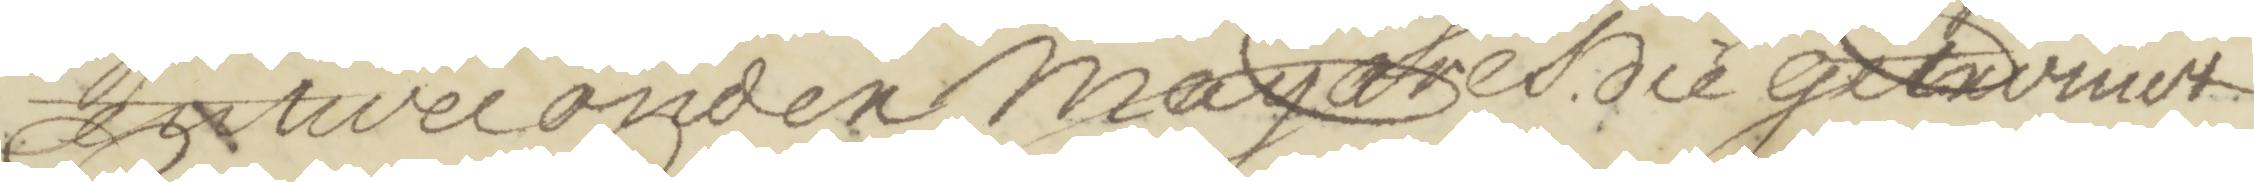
en twee onder Maijares die getrouwt
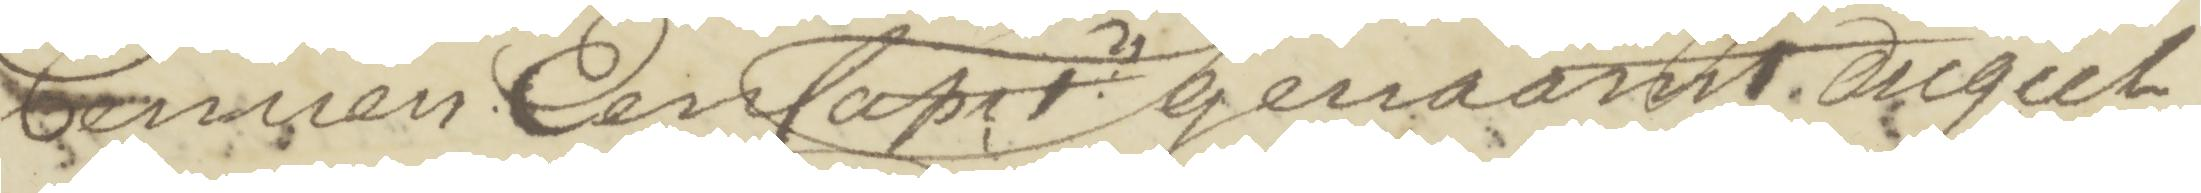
bennen Een Capit:n genaamt. dugeel
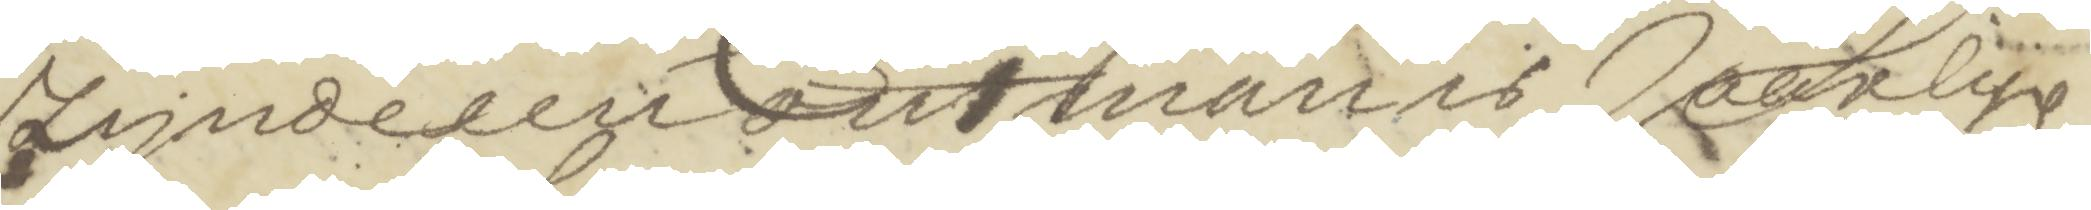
zijnde een out man is Jaarlijx
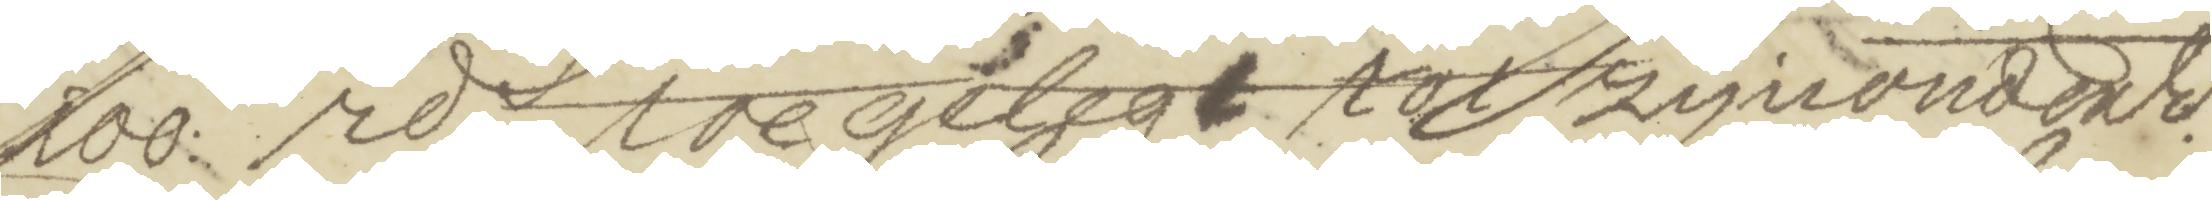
100: rd:s toegelegt tot zijn ouderh:t
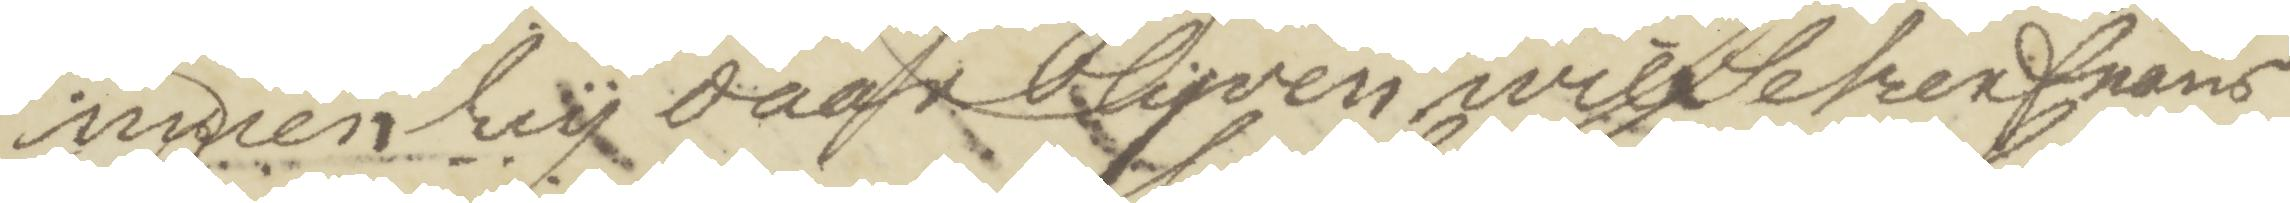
indien hij daar blijven wil seker Frans
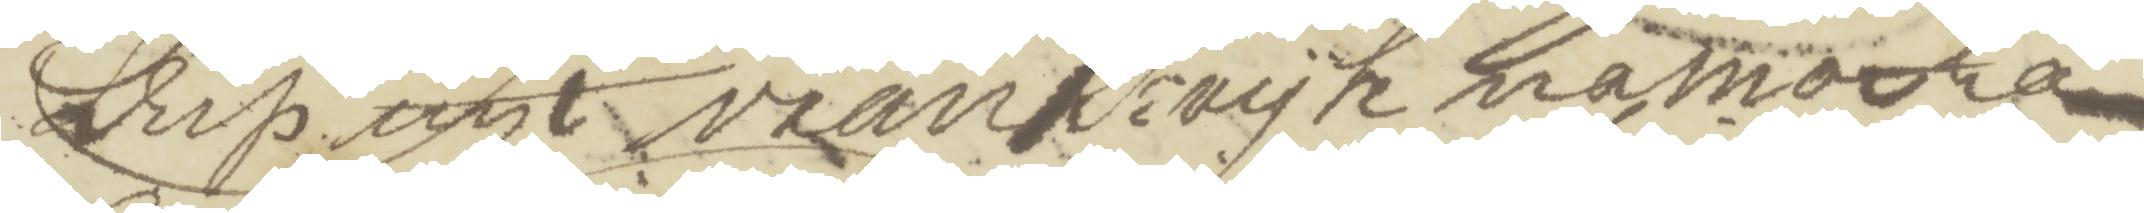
schip uijt vrankrijk na mocka
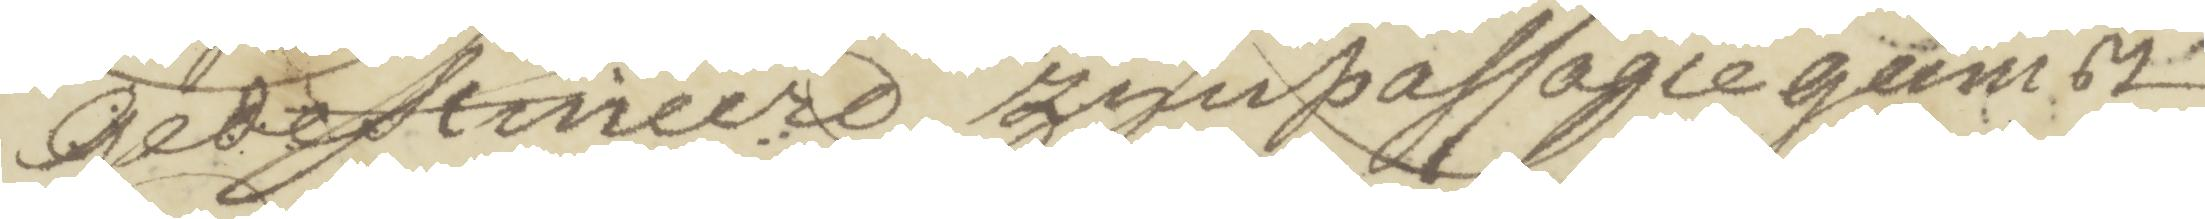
gedestineerd zijn passagie geemst
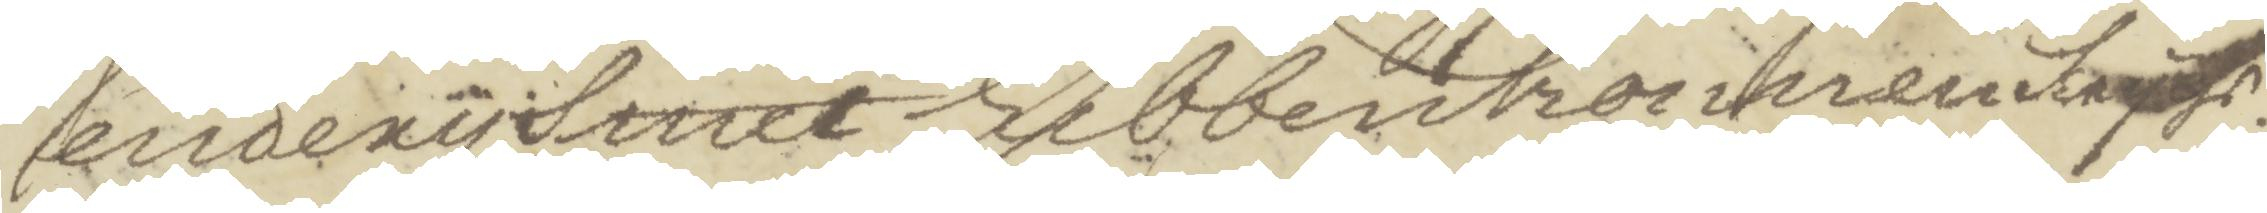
ende rijs niet hebben konnen krijgs
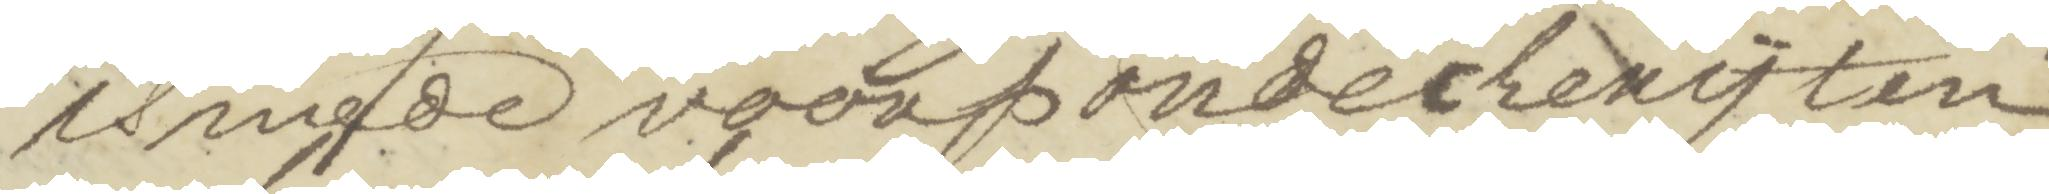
is mede voor pondecherij ten
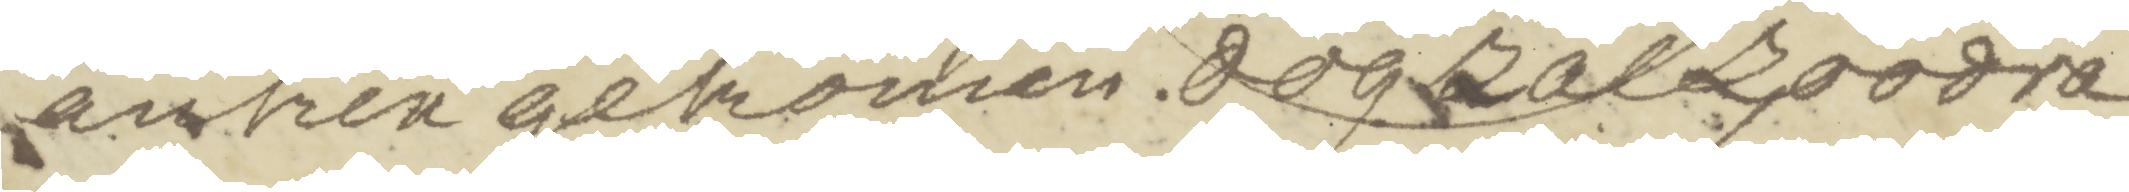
anker gekomen, dog zal zoodra
